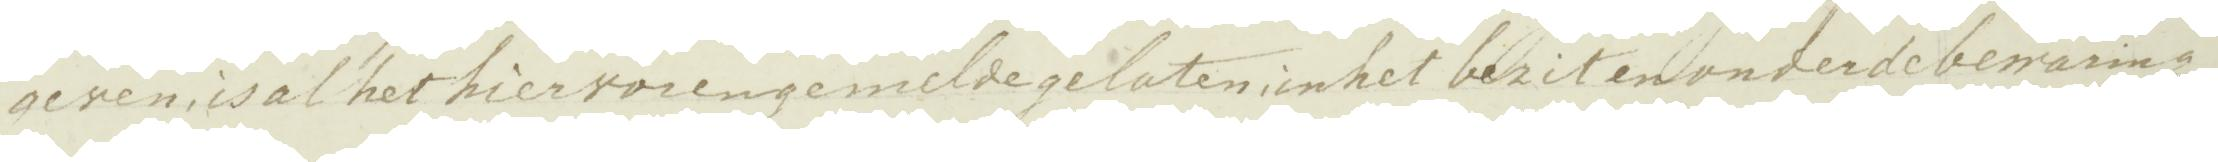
geven, is al het hiervoren gemelde gelaten, in het bezit en onder de bewaring
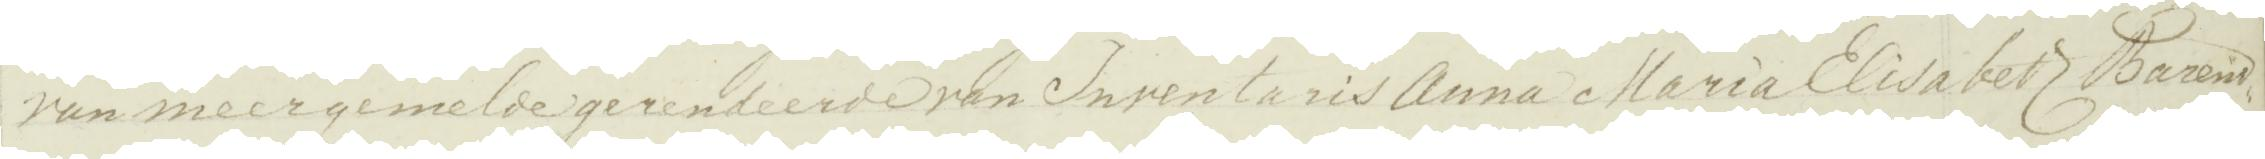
van meergemelde gerendeerde van Jnventaris Anna Maria Elisabeth Barend„
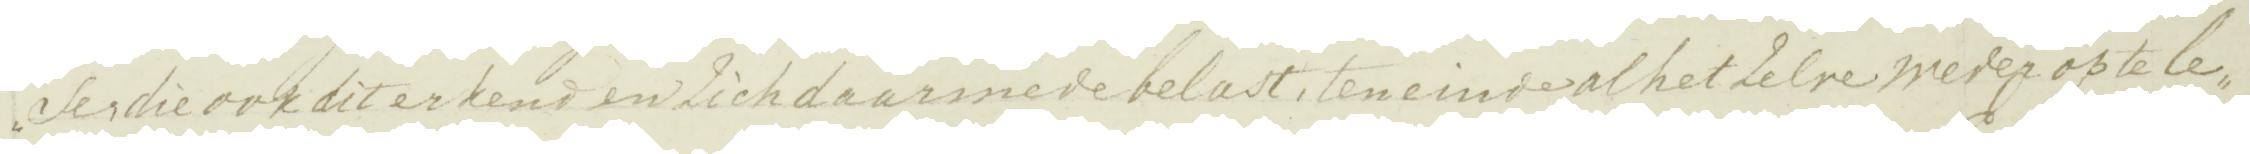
„se, die ook dit erkend en zich daarmede belast, ten einde al het zelve weder op te le„
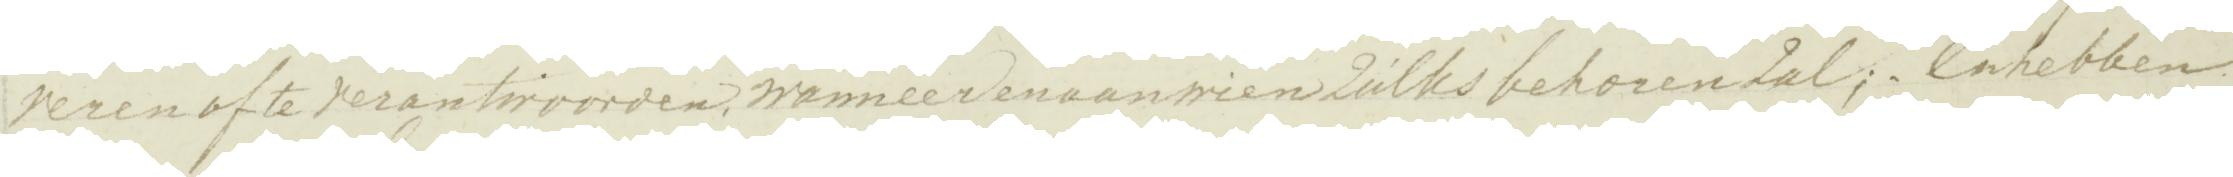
veren of te verantwoorden, wanneer en aan wien zulks behoren zal; - En hebben
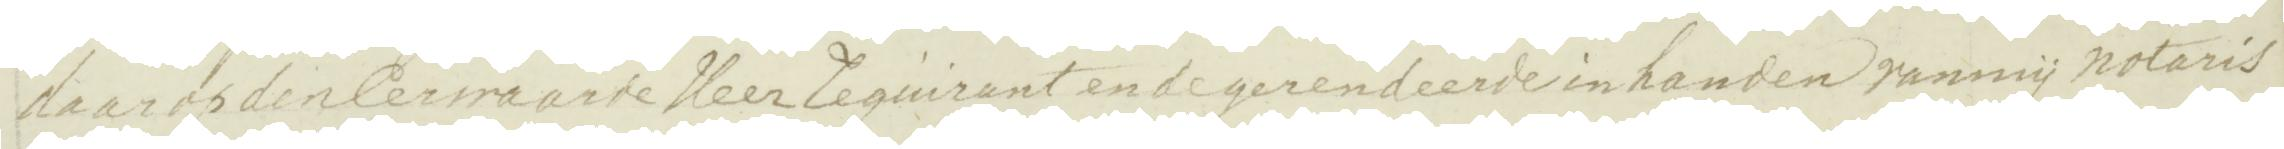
daarop den Eerwaarde Heer requirant en de gerendeerde in handen van mij notaris
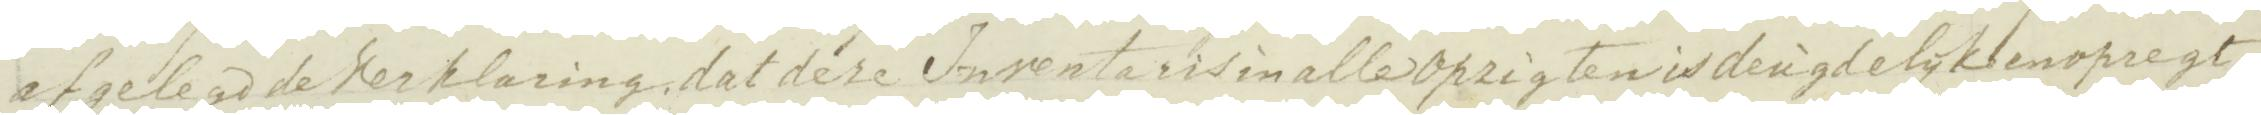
afgelegde verklaring, dat deze Jnventaris in alle opzigten is deugdelijk en opregt,
